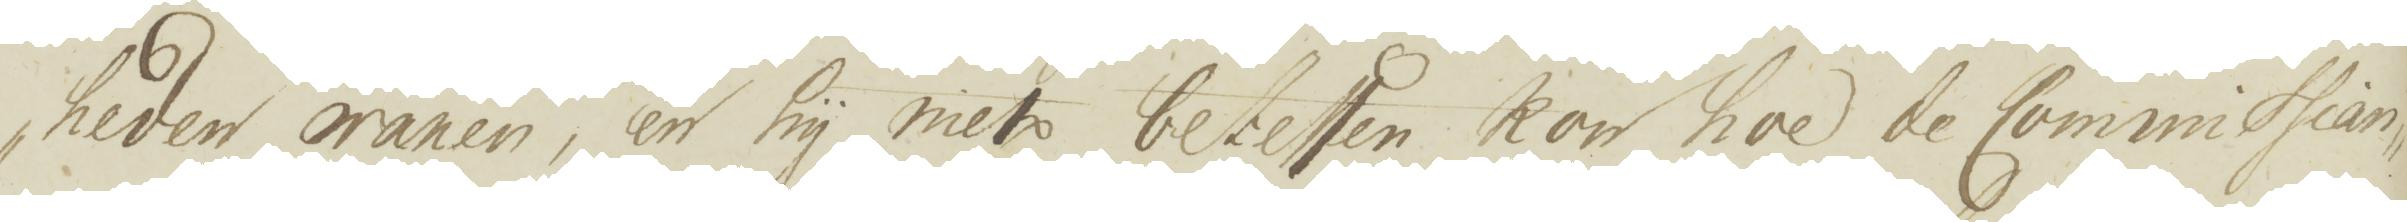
„heden waren, en hij niet bezeffen kon hoe de Commissian„
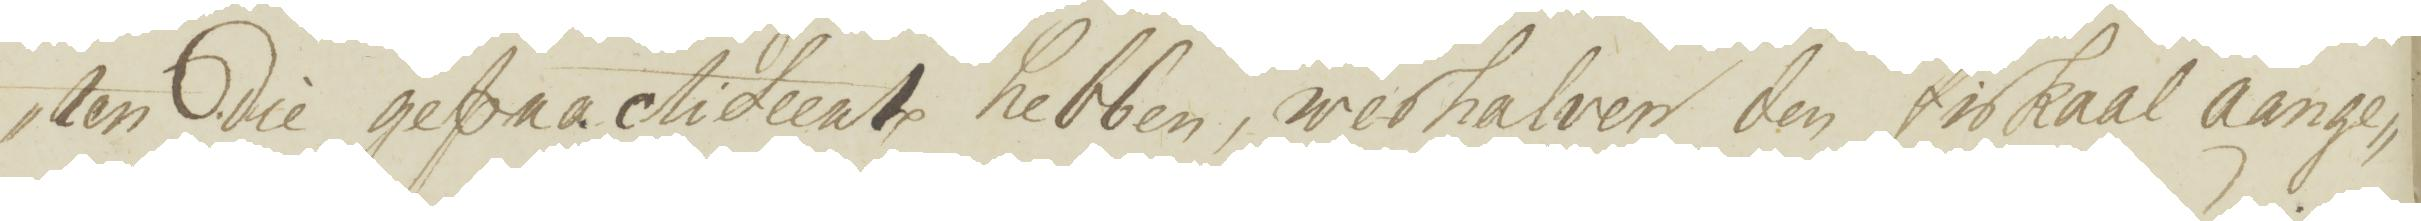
„ten die gepractiseert hebben, weshalven den fiskaal aange„
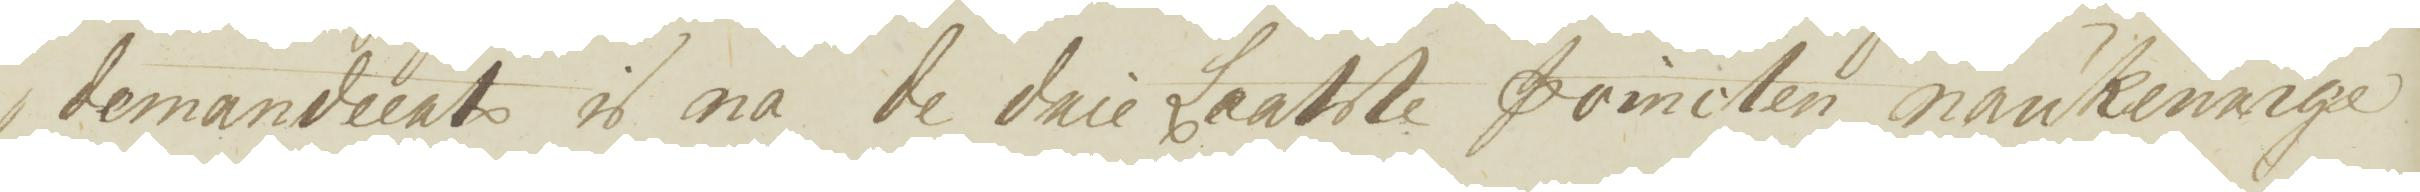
„demandeert is na de drie Laatste poincten naukeurige
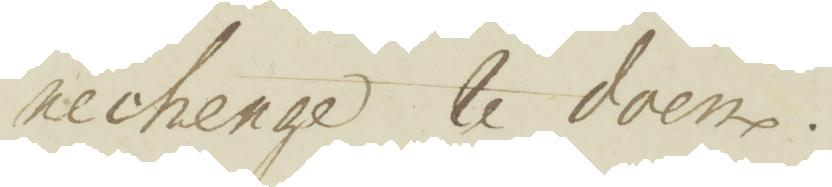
recherge te doen.
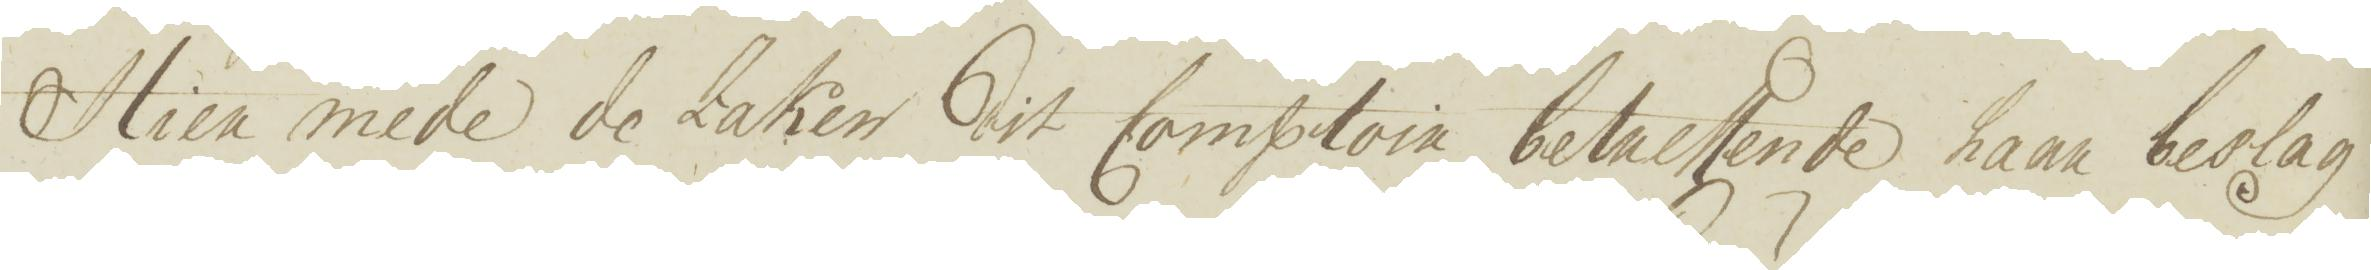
Hier mede de Zaken dit Comptoir betreffende haar beslag
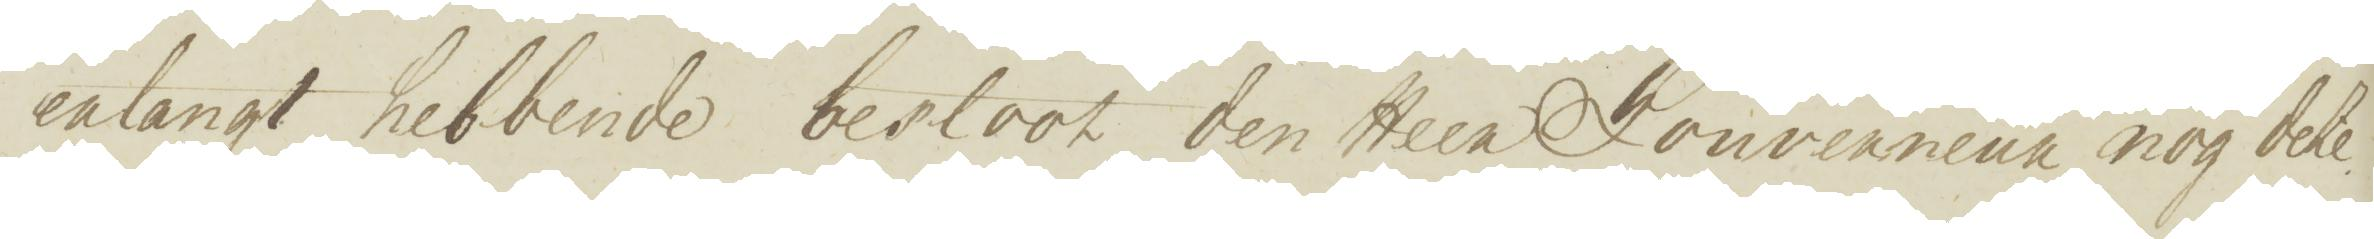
erlangt hebbende besloot den Heer Gouverneur nog deze„
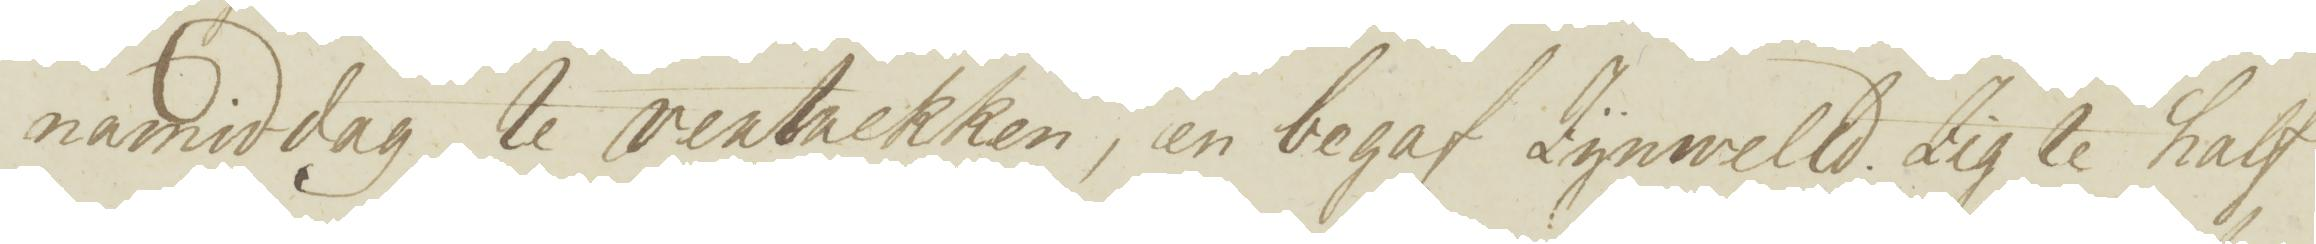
namiddag te vertrekken, en begaf Zijn welEd. zig te half
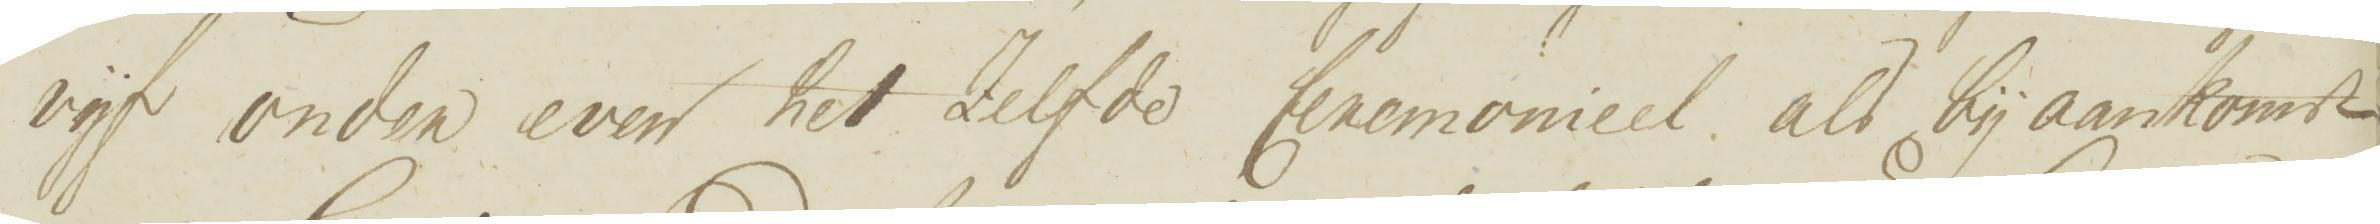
vijf onder even het Zelfde Ceremonieel als bij aankomst
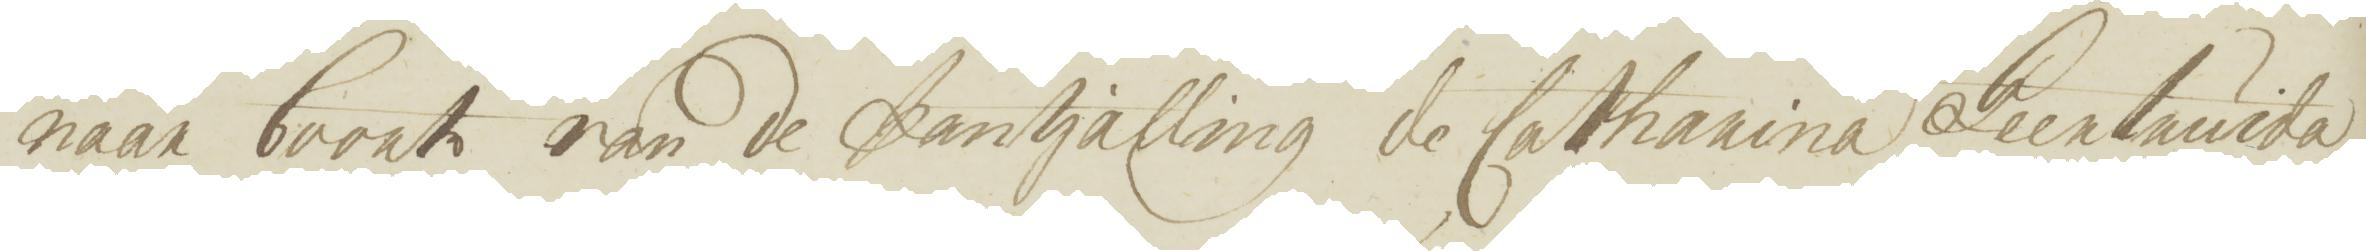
naar boort van de Pantjalling de Catharina Geertruida,
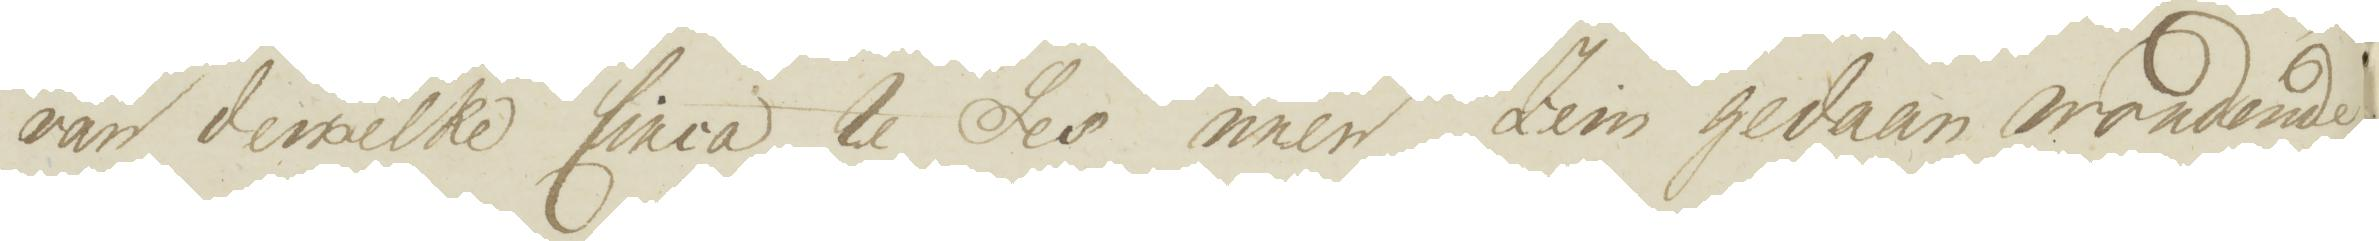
van dewelke Circa te Ses uren Zein gedaan wordende
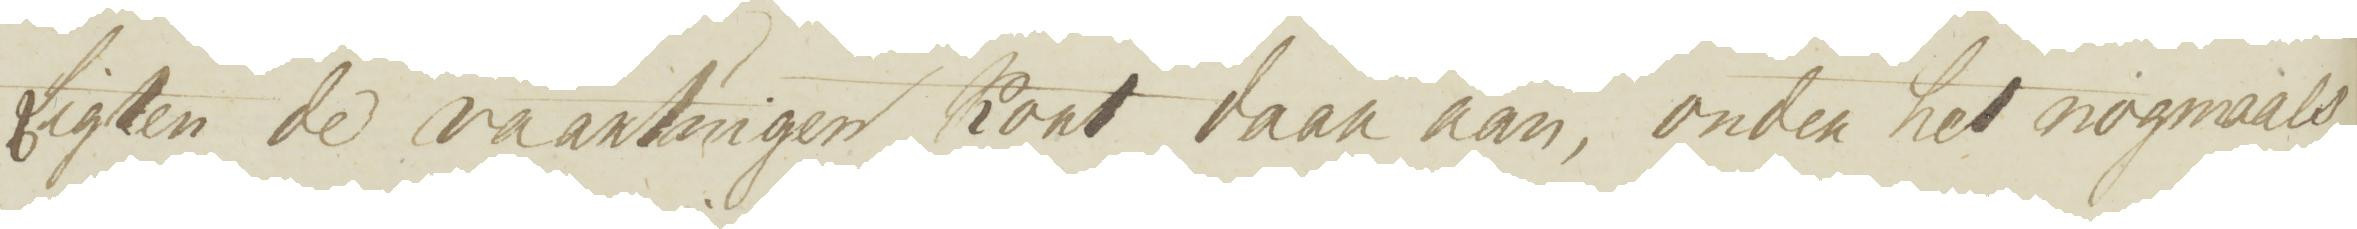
Ligten de vaartuigen kort daar aan, onder het nogmaals
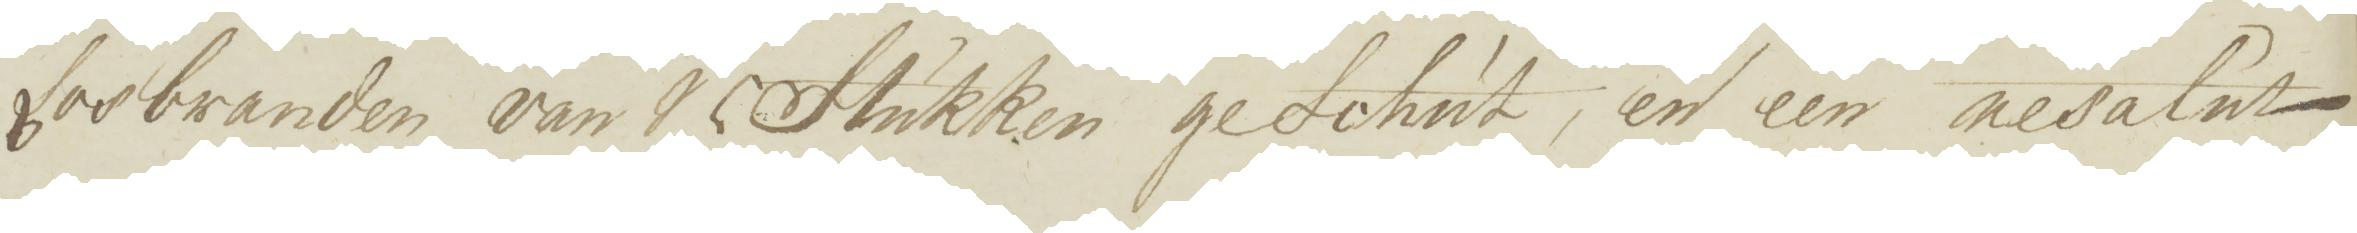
Losbranden van 15 Stukken geschut, en een resalut
